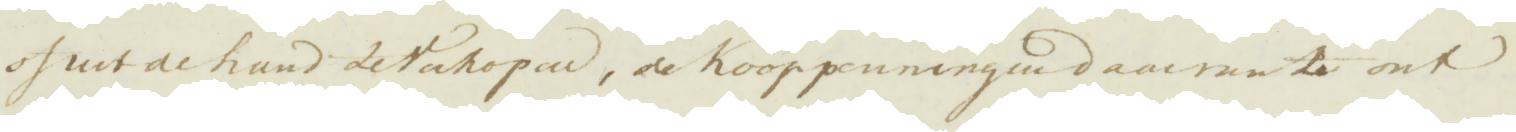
of uit de hand te Verkopen, de Kooppenningen daarvan te ont
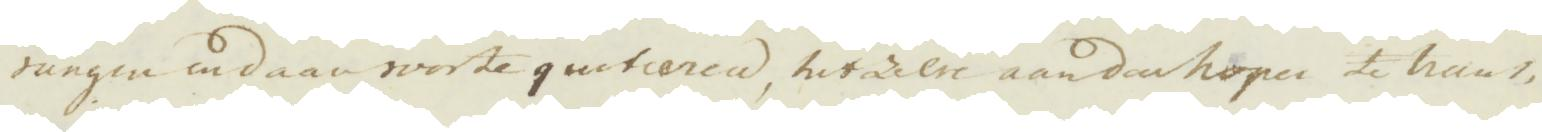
vangen en daar voor te quitieren, hetzelve aan den koper te trans,
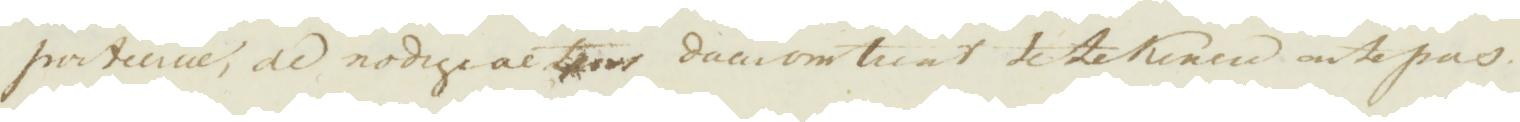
porteeren, de nodige actens daar omtrent te tekenen en te pas.
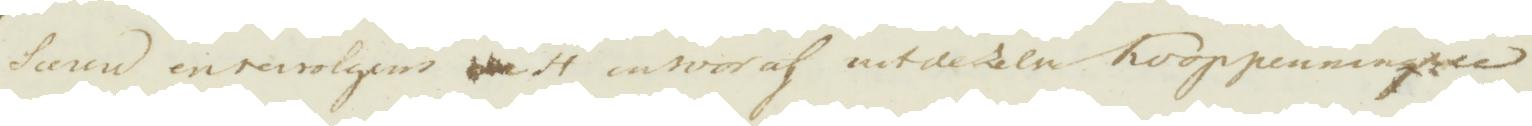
seeren en vervolgens eerst en voor af uit de zelve kooppenningen
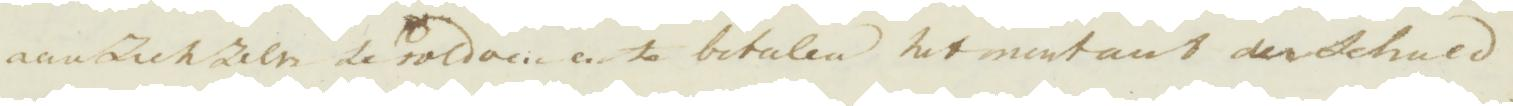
aan Zich zelve de voldoen en te betalen het montant der schuld
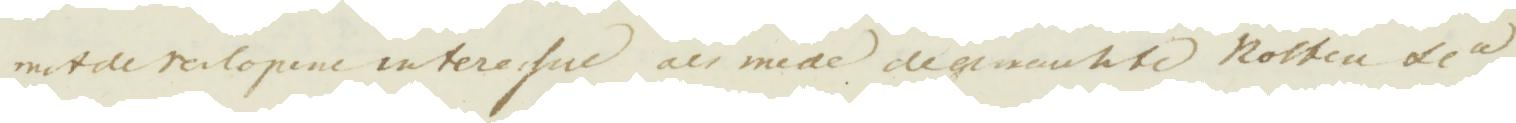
met de verlopene interessen als mede de gemaakte kosten &c:a
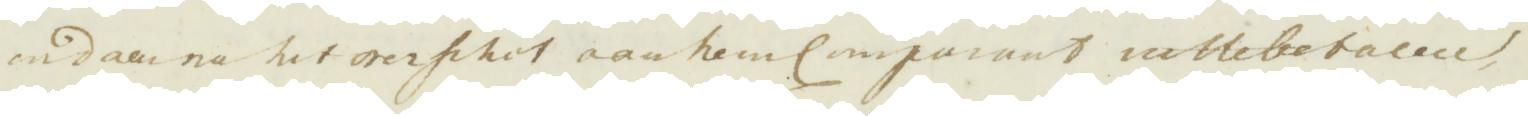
en daar na het overschot aan hem Comparant niet te betalen,
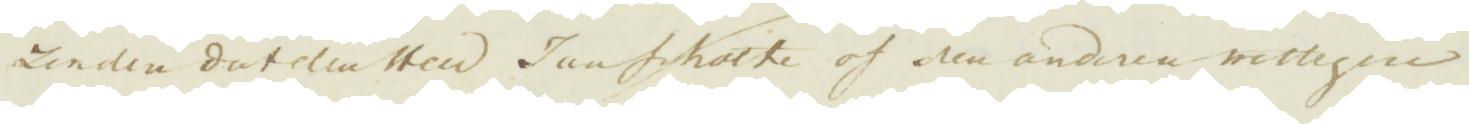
zonder dat den Heer Jan Scholte of den anderen wettigen
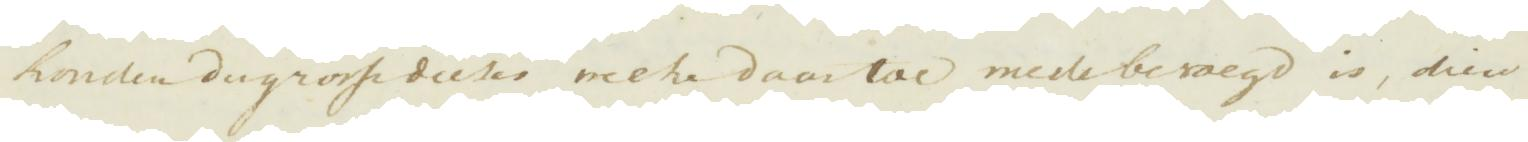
houder der grosse deezes welke daar toe mede bevoegd is, dien
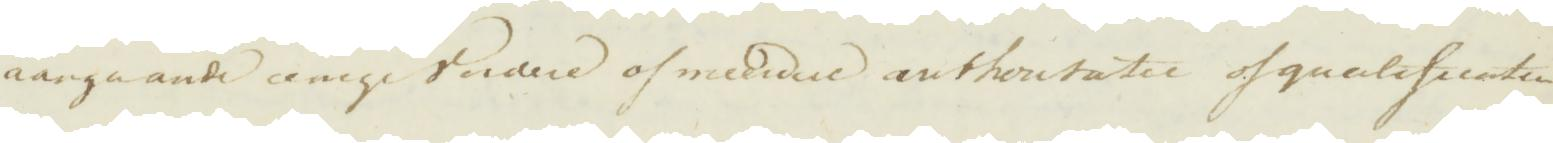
aangaande eenige Verdere of meerdere authorisatie of qualificatie
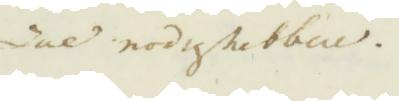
zal nodig hebben.
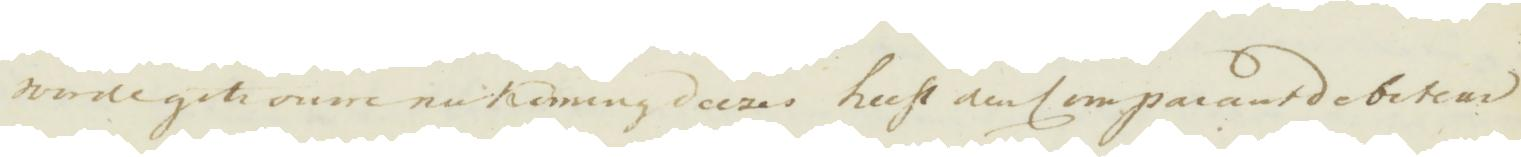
voor de getrouwe nakoming deezes heeft den Comparant debiteur
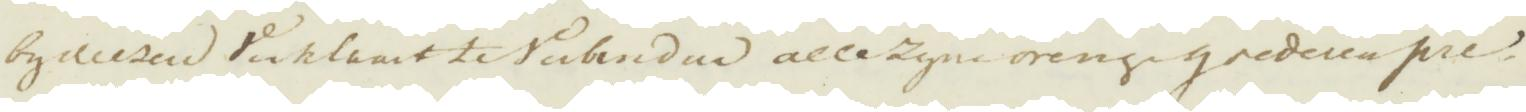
by deezen Verklaart te Verbinden alle Zyne overige goederen pre=
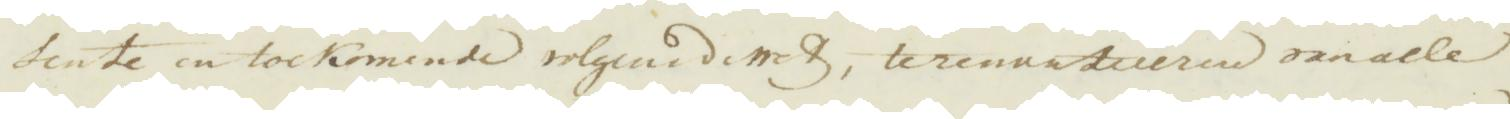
sente en toekomende volgens de wet, te renuntieeren van alle
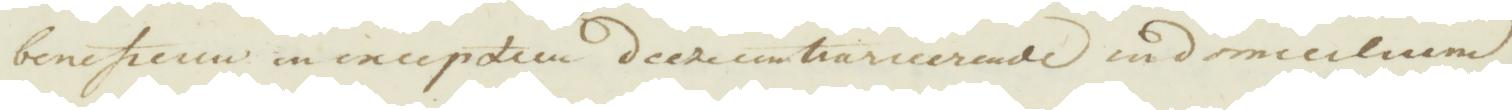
beneficien en exceptien deeze contrarieerende en domicilium
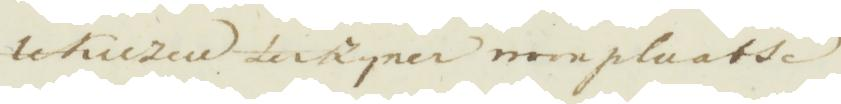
te kiezen ter zyner woonplaatse
